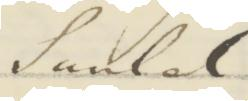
sarlet
